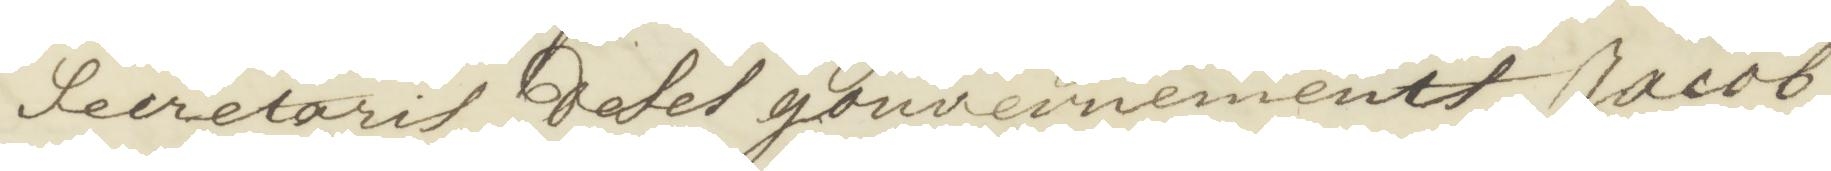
secretaris deses gouvernements Jacob
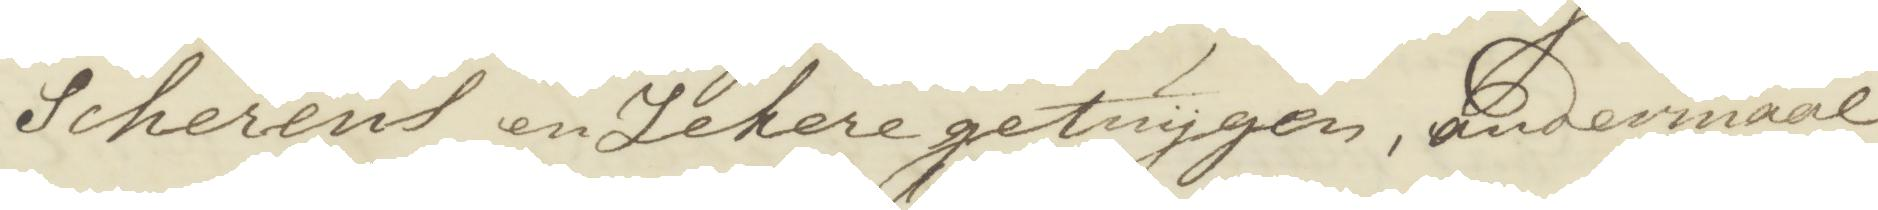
scherens en zekere getuijgen, andermaal
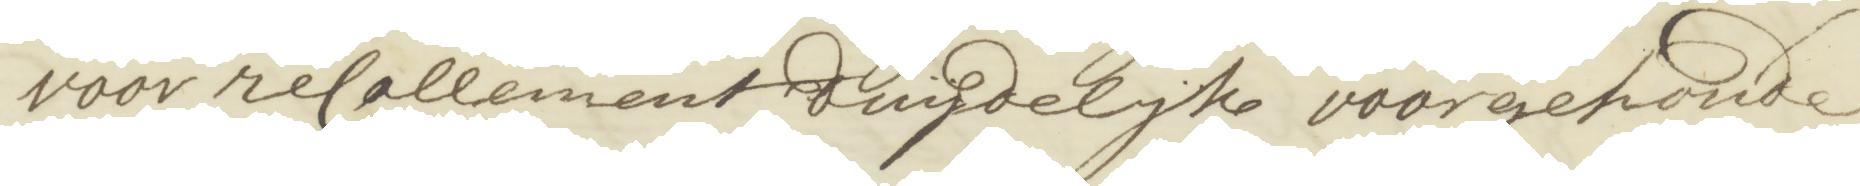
voor recallement duijdelijk voorgehoude
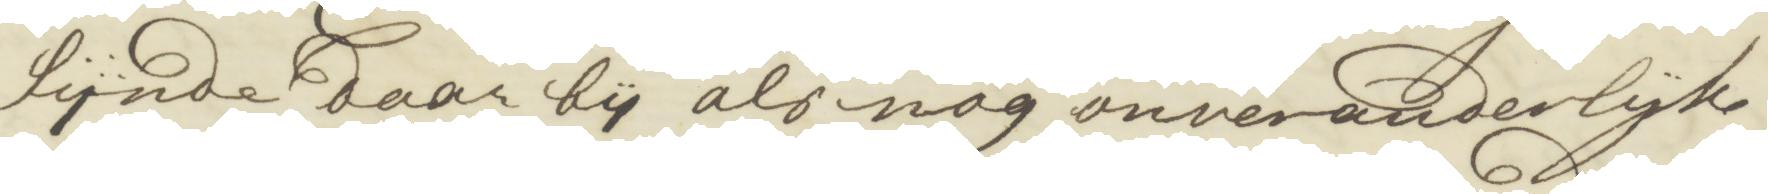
sijnde daar bij als nog onveranderlijk
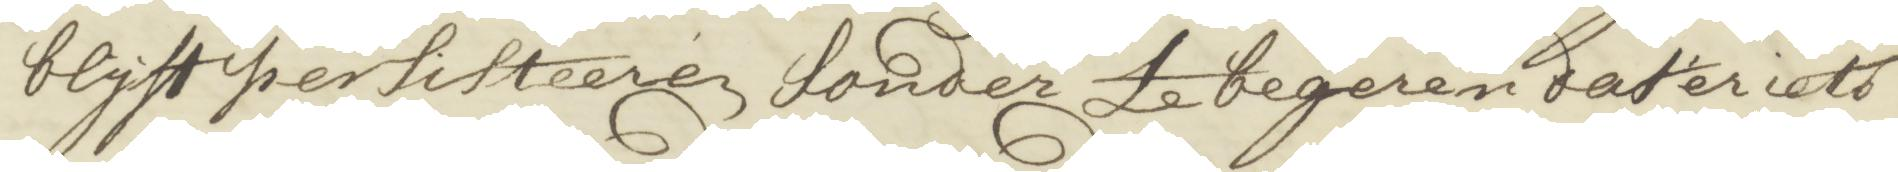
blijft persisteeren sonder te begeren dat 'er iets
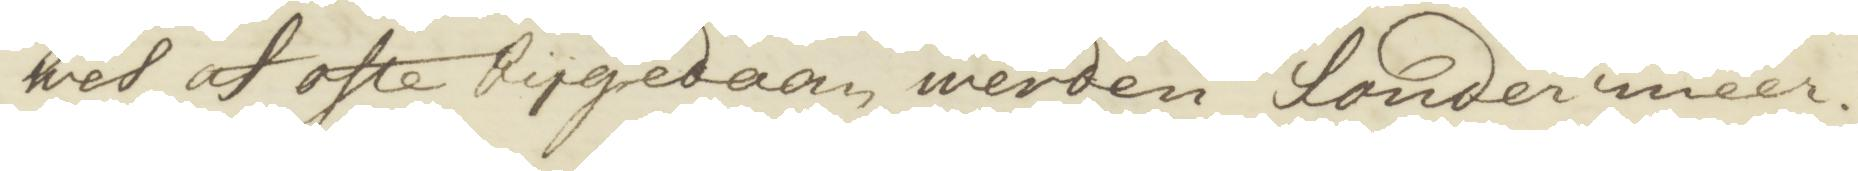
wes af ofte bijgedaan werden sonder meer
